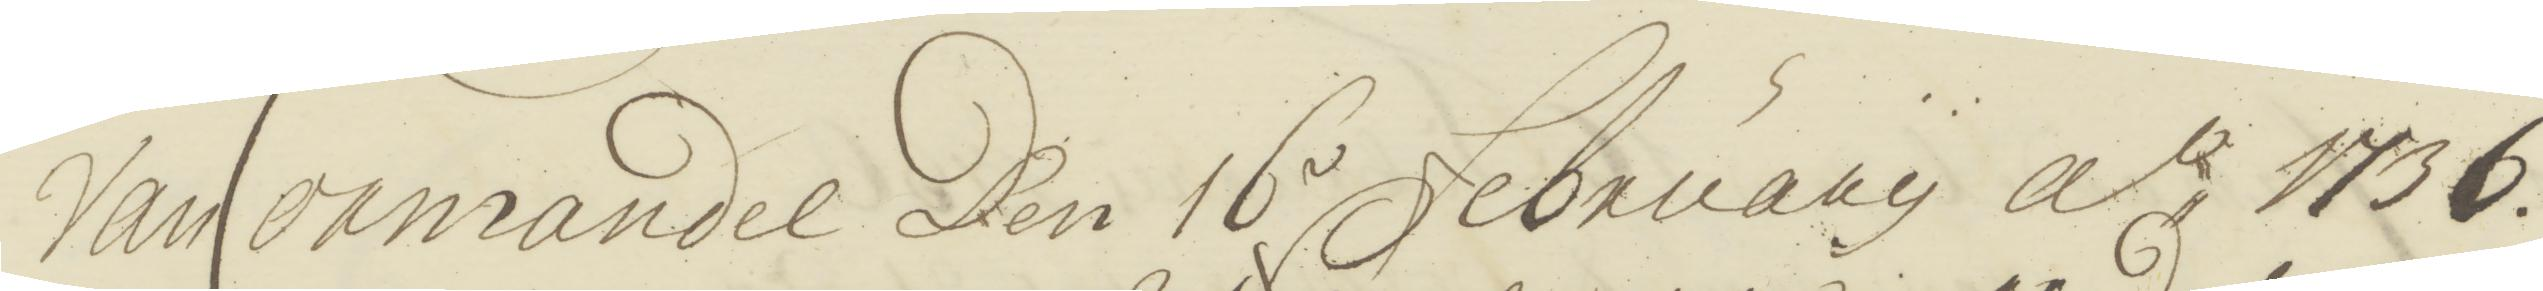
Van Cormandel Den 16e Februarij a„o 1736.
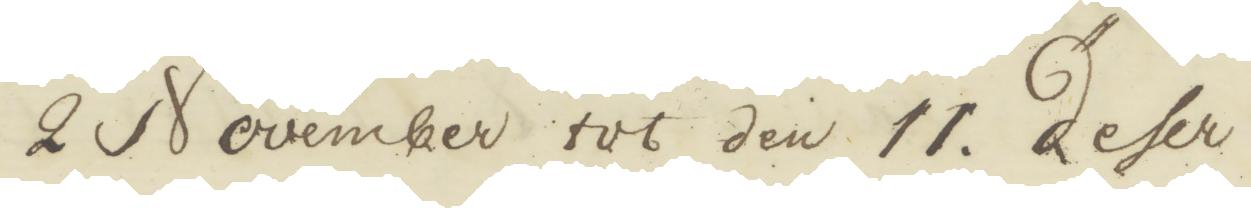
2 November tot den 11. deser
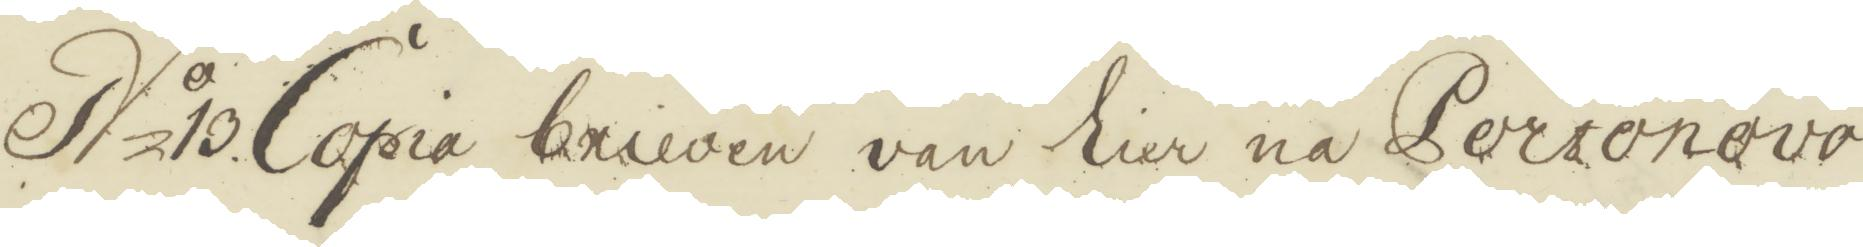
N=o 13. Copia brieven van hier na Pertonovo
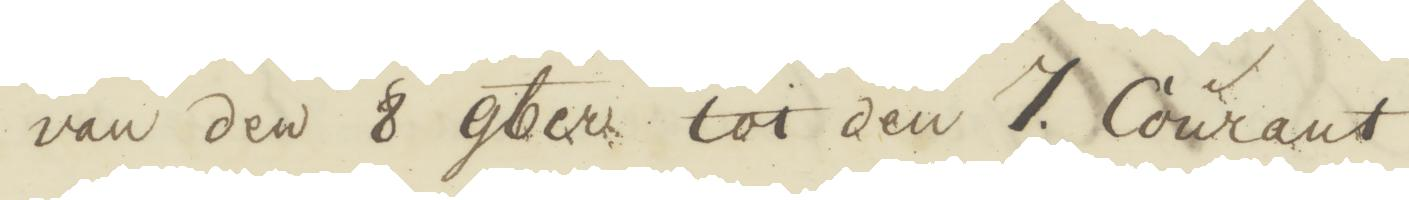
van den 8 9ber tot den 7. Courant
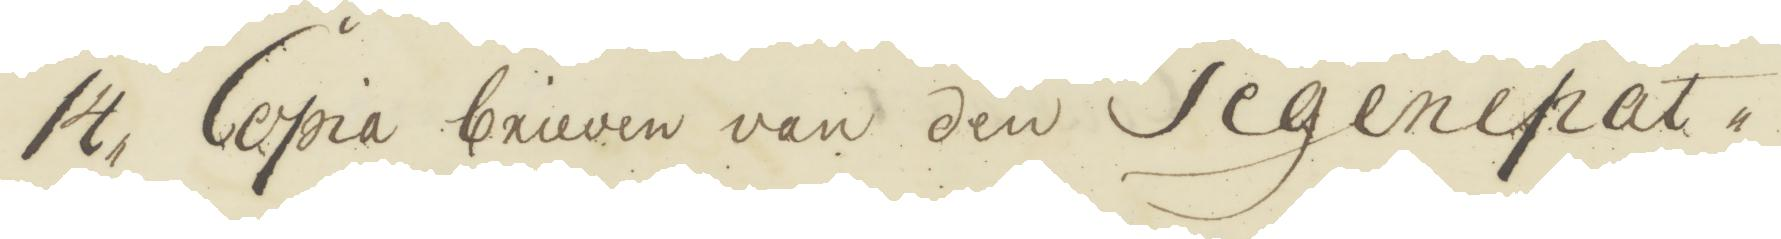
14„ Copia brieven van den Tegenepat„
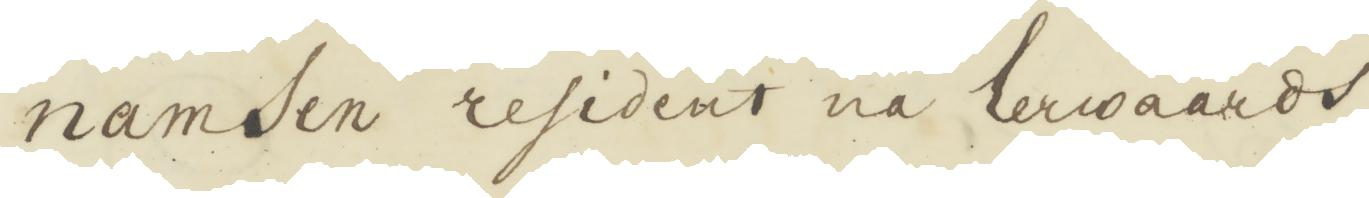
namsen resident na herwaards
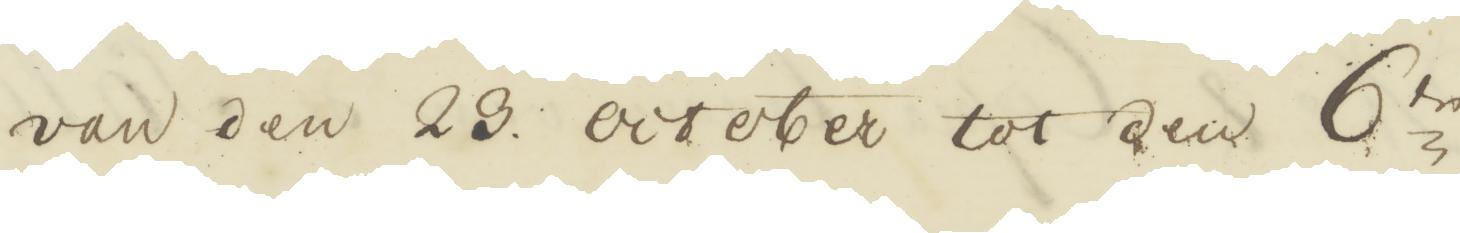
van den 23. october tot den 6„te
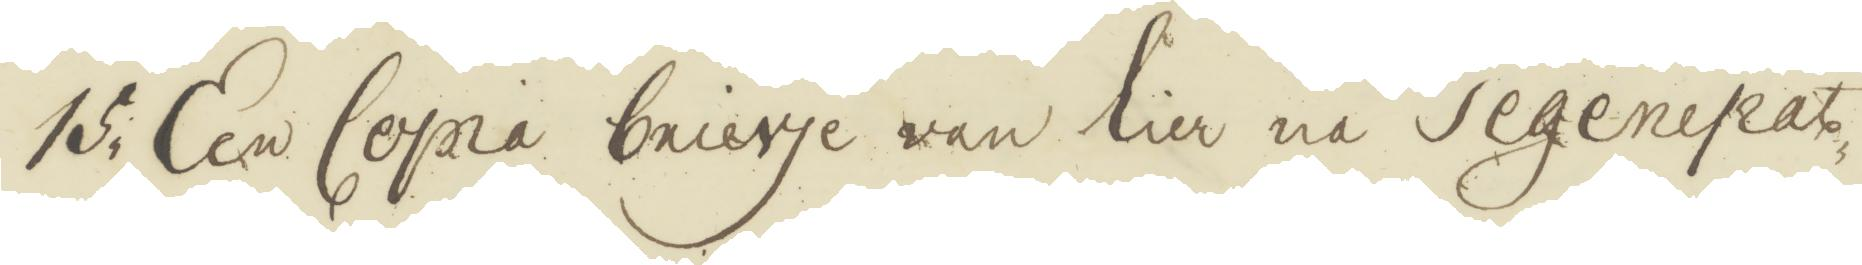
15„ Een Copia brievje van hier na Tegenepat„
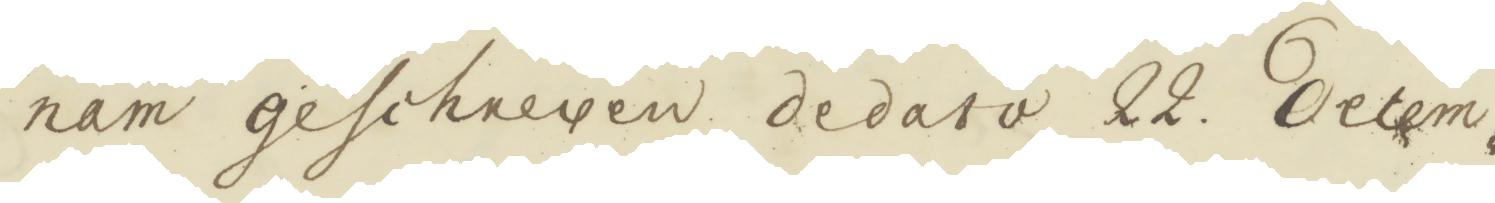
nam geschreven de dato 22. decem„
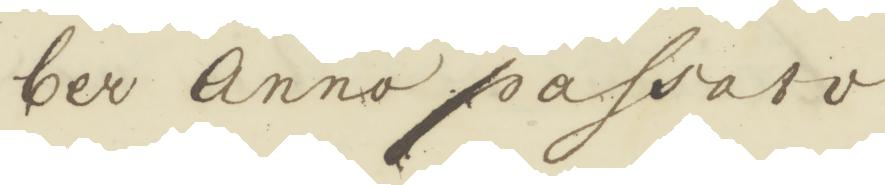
ber anno passato
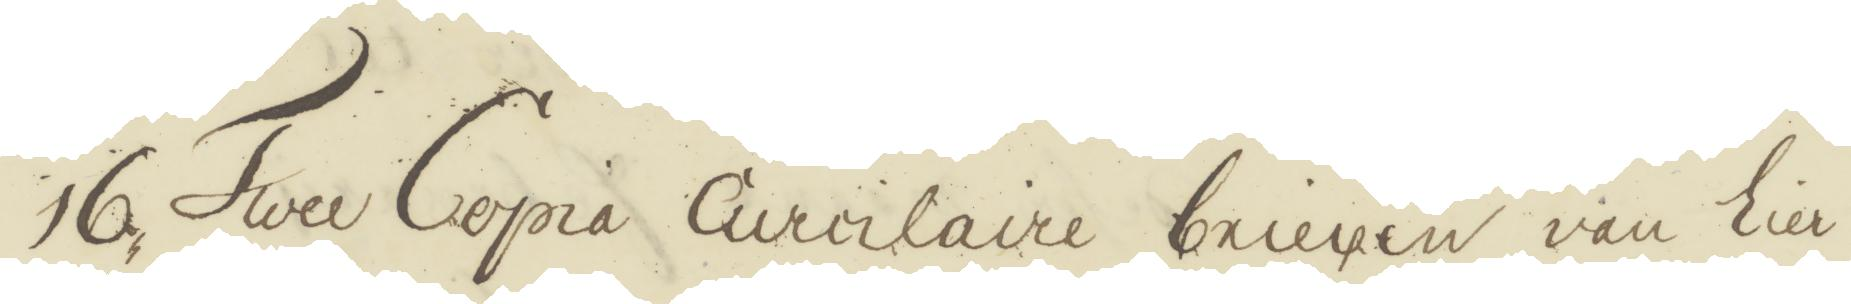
16„ Twee Copia Curcilaire brieven van hier
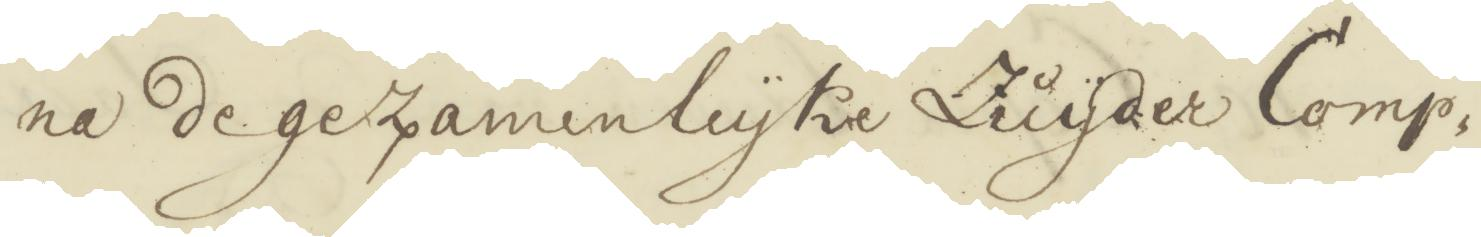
na de gezamenleijke Zuijder Comp„
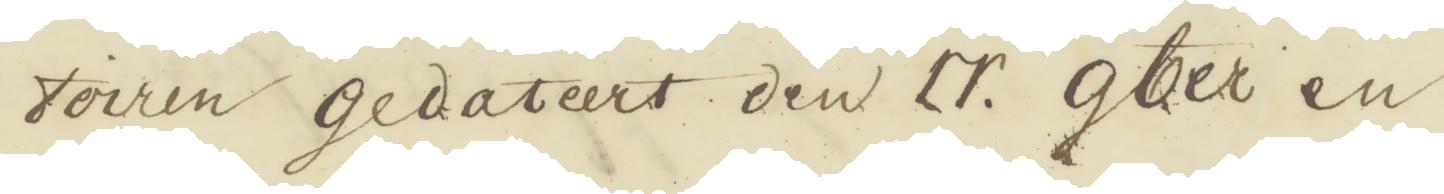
toiren gedateert den 11. 9ber en
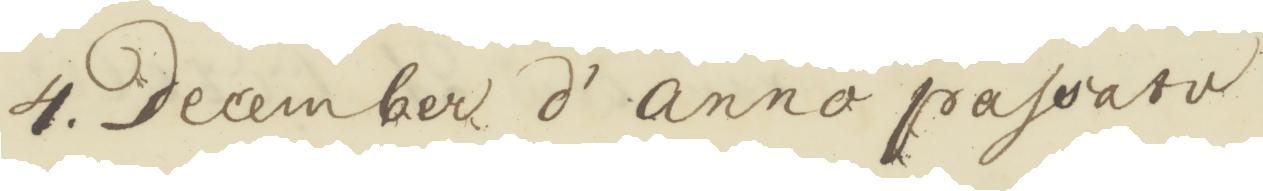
4. December d’ anno passato
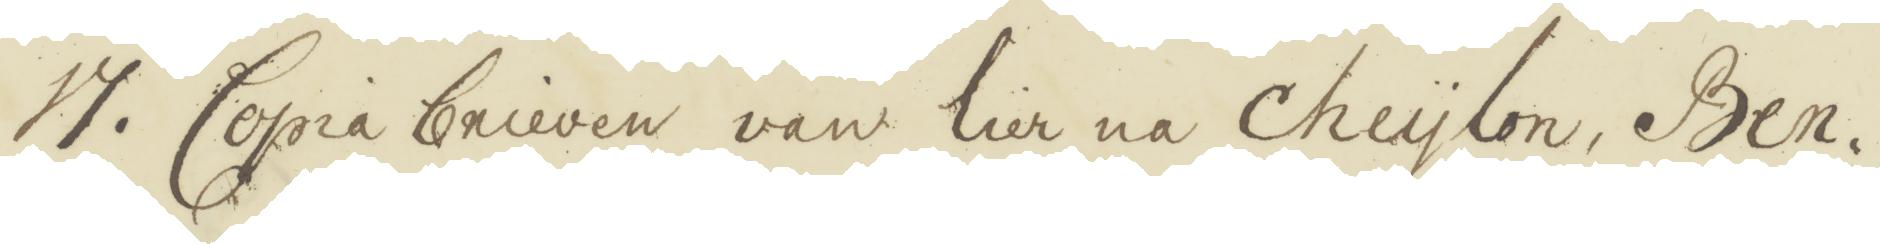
17. Copia brieven van hier na Cheijlon, Ben„
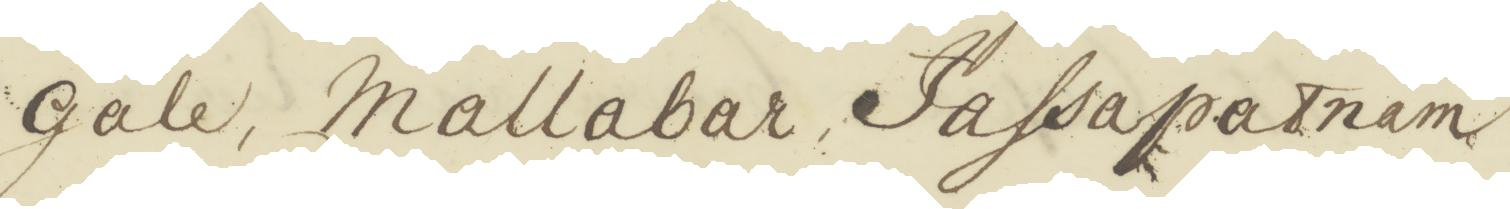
gale, Mallabar, Iassapatnam
